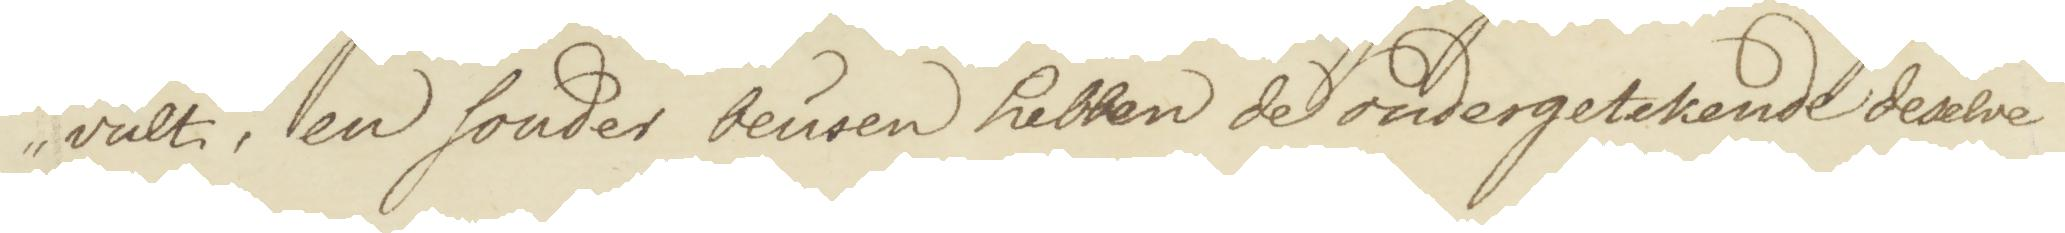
„vult, en sonder beusen hebben de ondergetekende deselve
